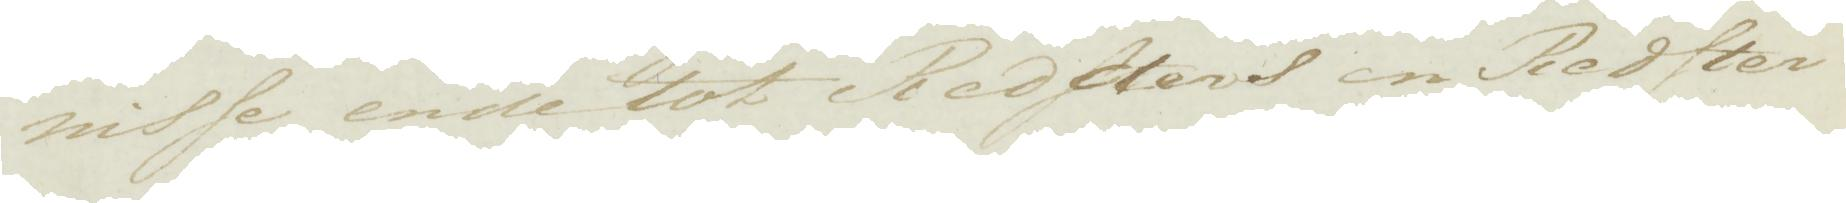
nisse ende tot Redders en Redster
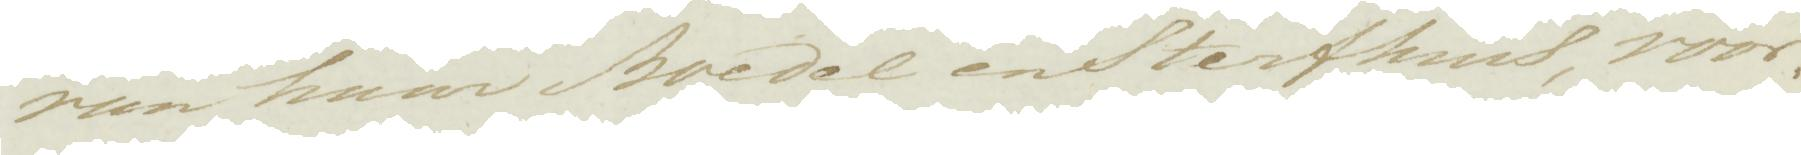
van haar Boedel en sterfhuis, voor
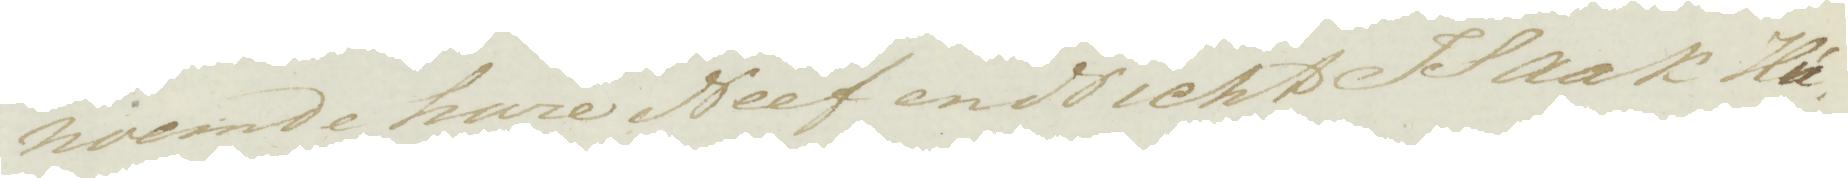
noemde hare Neef en Nicht Isaak Hu,
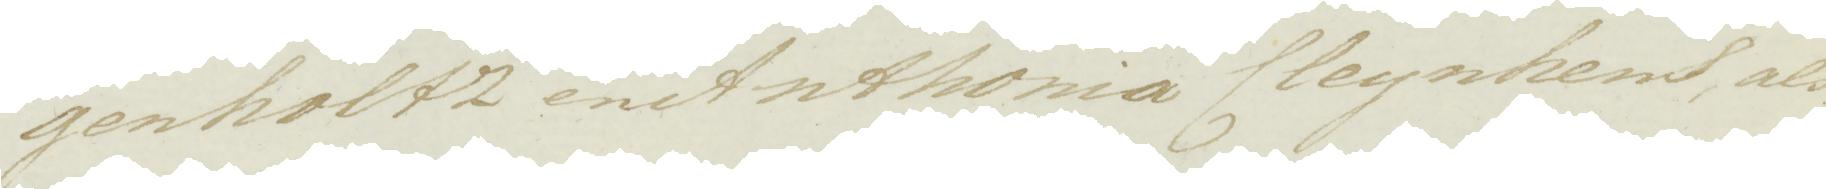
genholtz en Anthonia Cleynhens, al
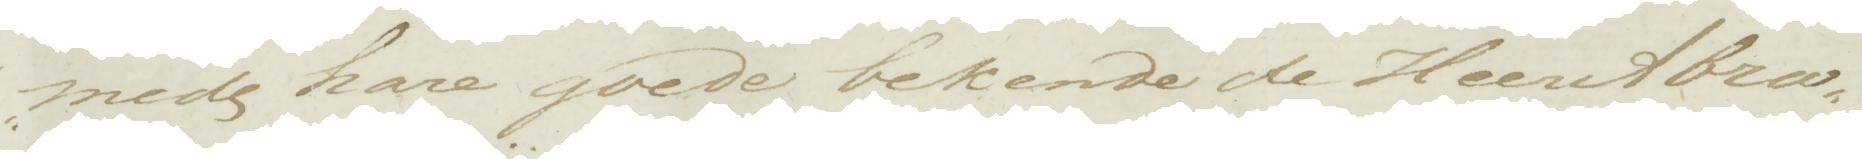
mede hare goede bekende de Heer Abra„
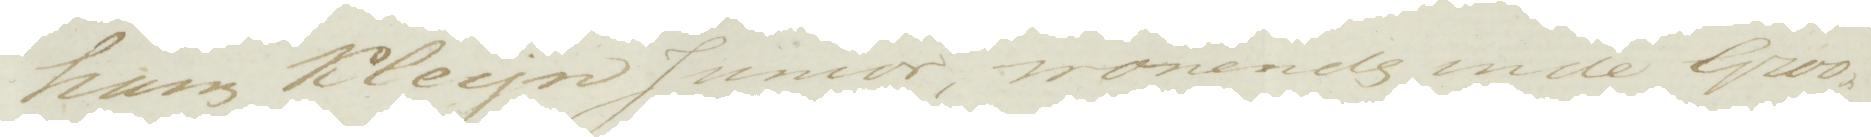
ham Kleijn Junior, wonende in de Groo„
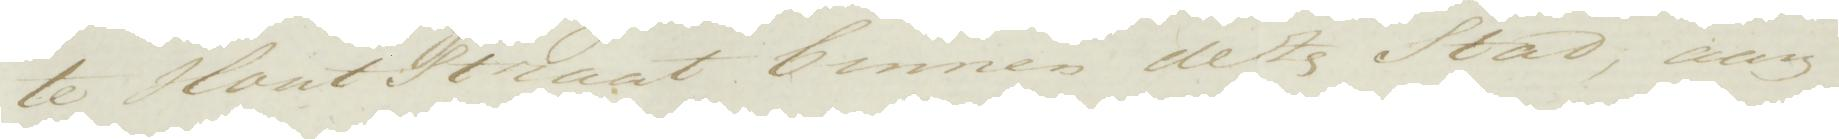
te Houtstraat binnen deze stad, aan
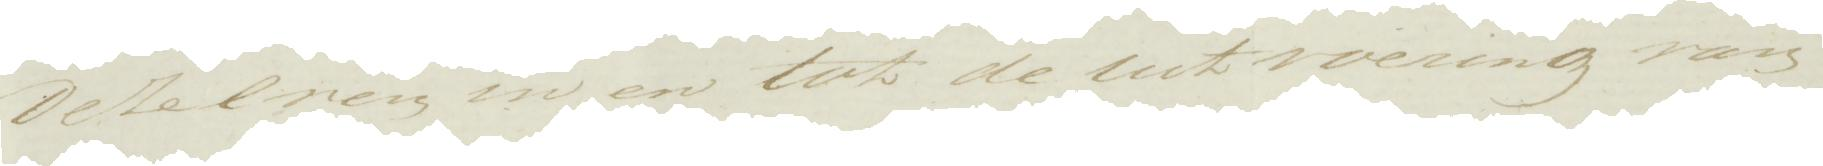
dezelven in en tot de uitvoering van
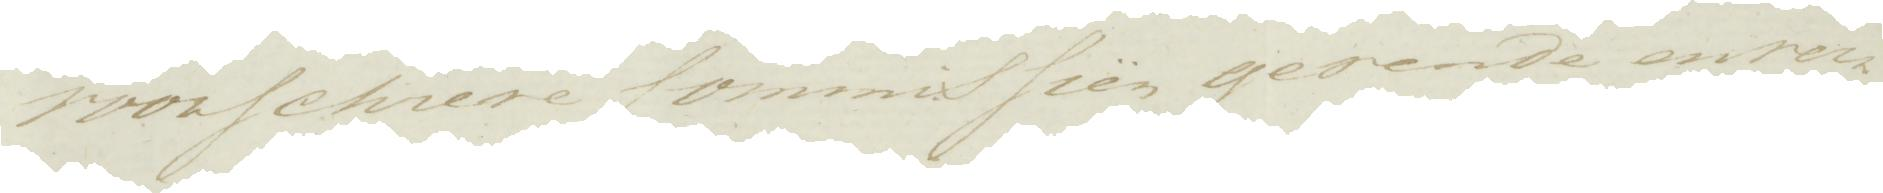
voorschreve Commissien gevende en ver
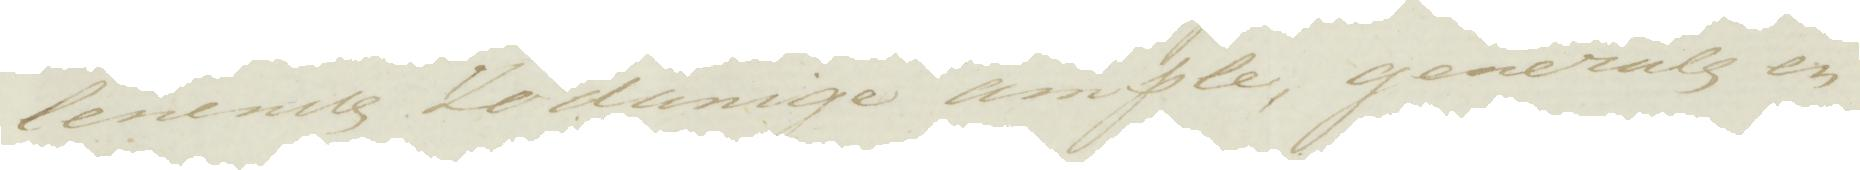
lenende zodanige ample, generale en
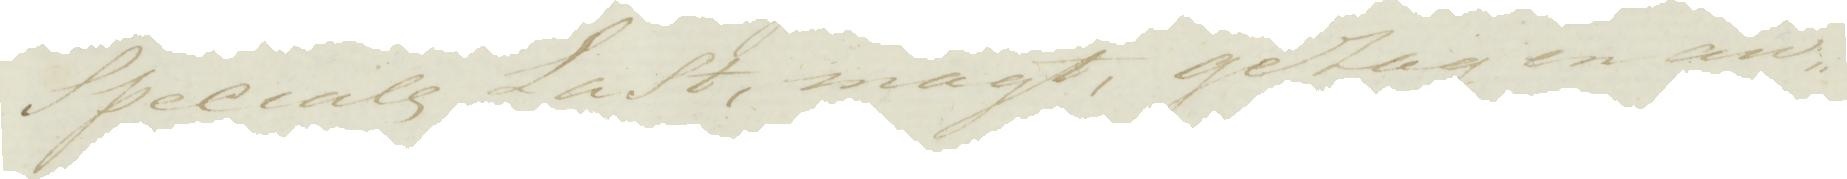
speciale Last, magt, gezag en au„
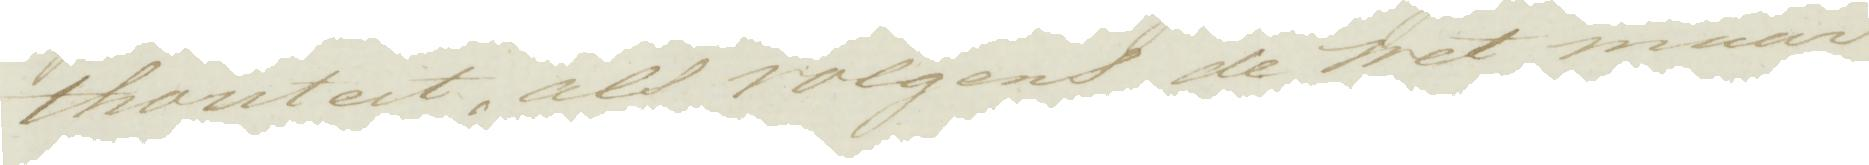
thoriteit, als volgens de wet maar
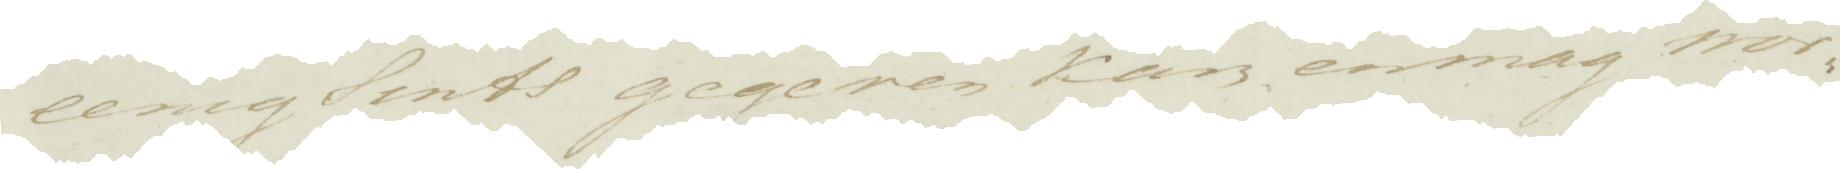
eenigsints gegeven kan en mag wor
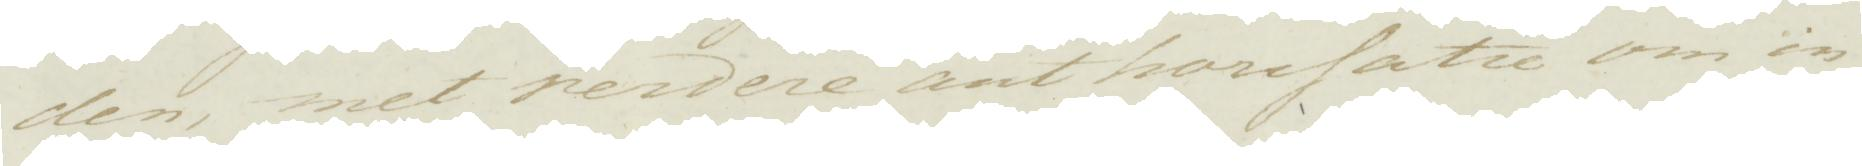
den, met verdere authorisatie om in
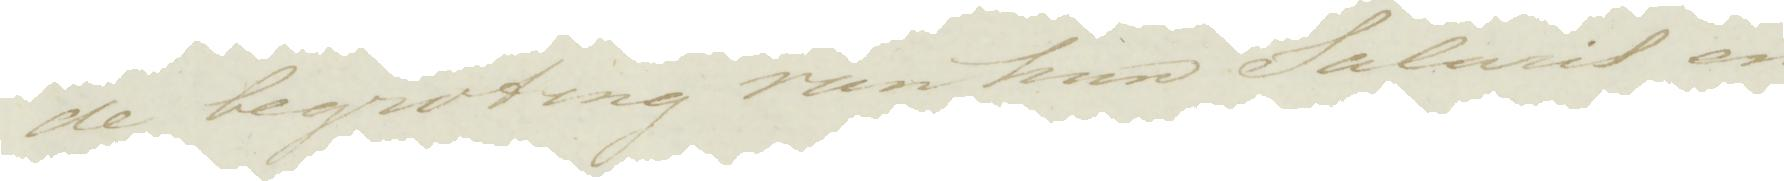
de begroting van hun Salaris en
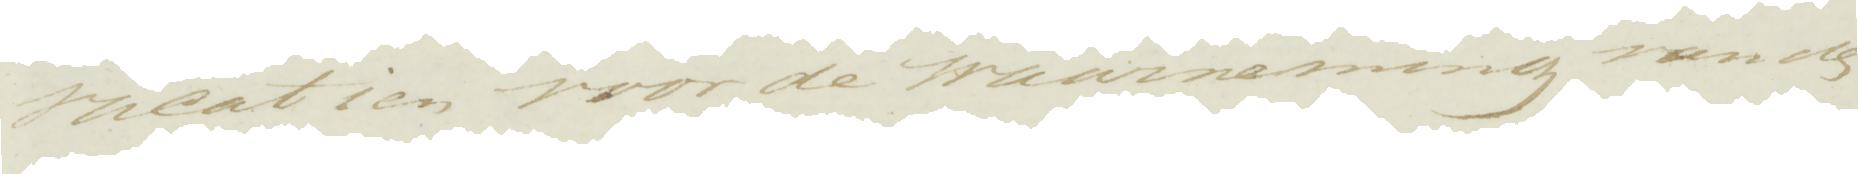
vacatien voor de waarneming van de
